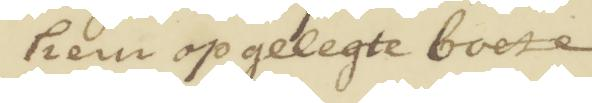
hem opgelegte boete
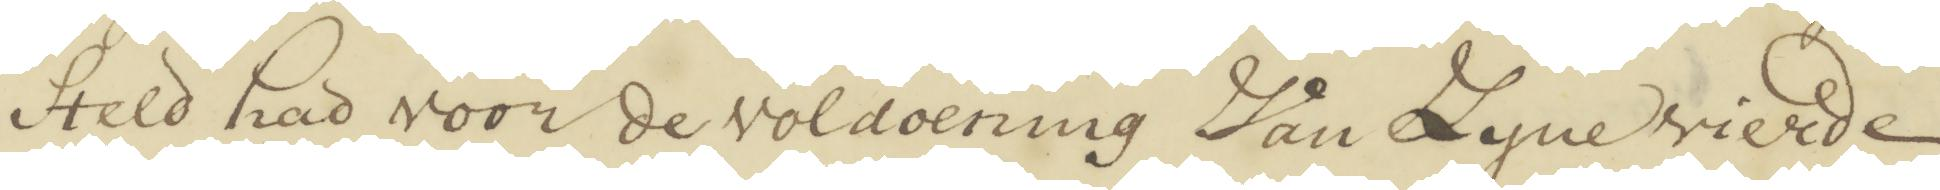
steld had voor de voldoening van zijne vierde
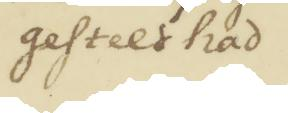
gesteld had.
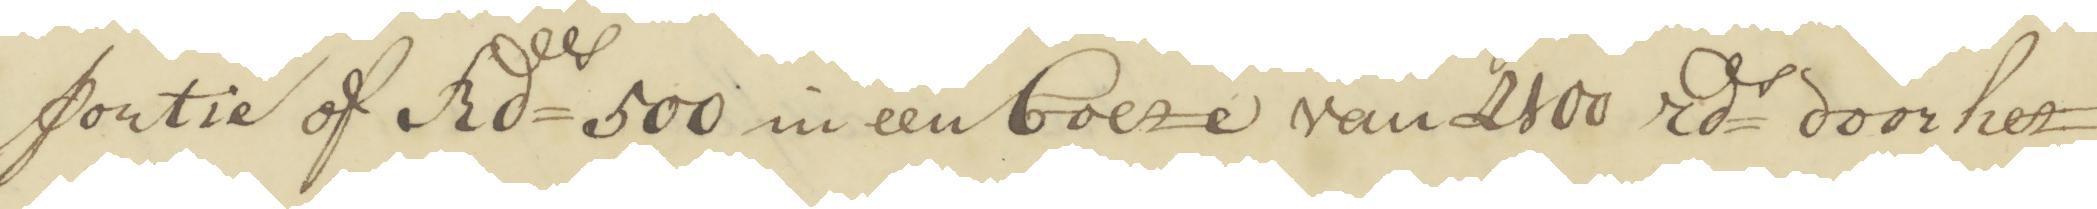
portie of Rd=s 500 in een boete van 2100 rd=s door het
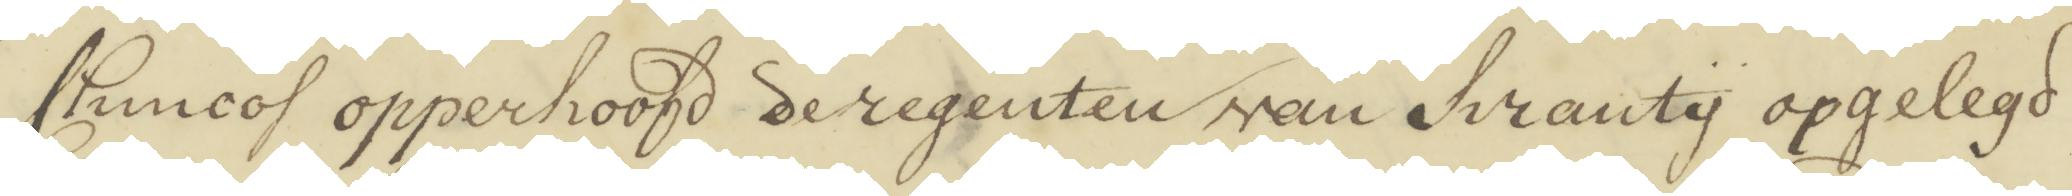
Chincos opperhoofd de regenten van sirantij opgelegd
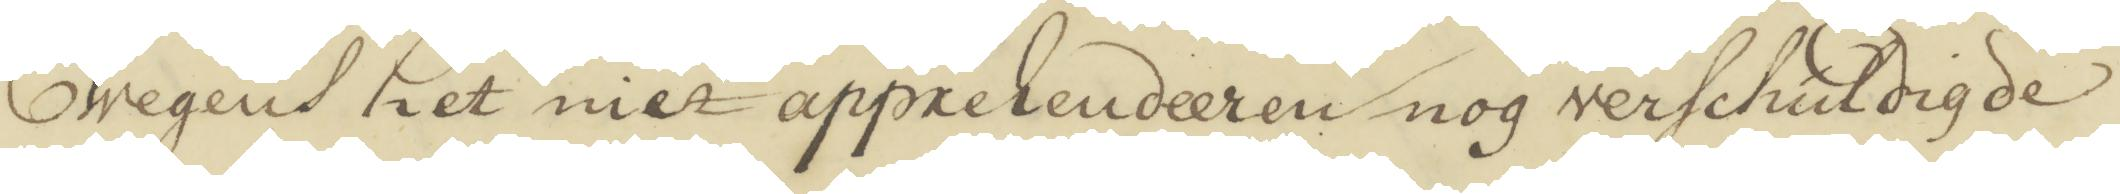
wegens het niet apprehendeeren nog verschuldigde
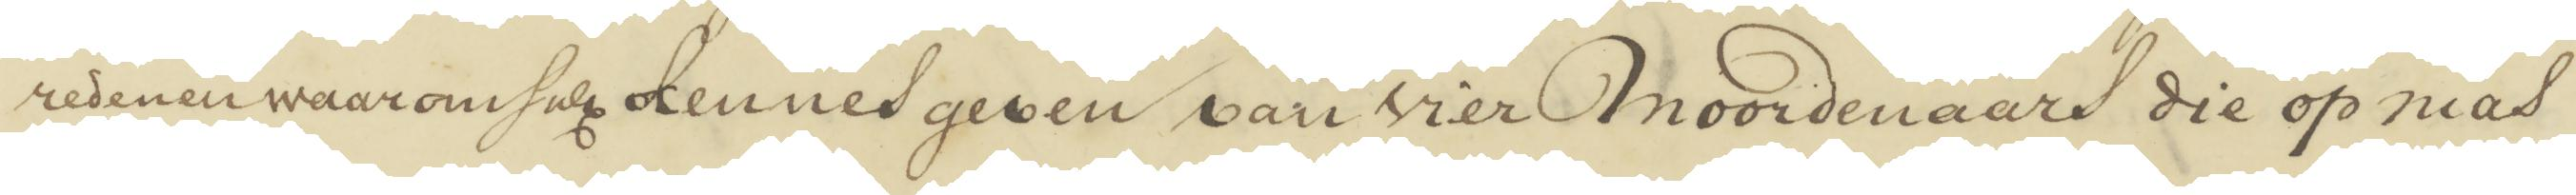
redenen waarom sulx kennes geven van vier moordenaars die op nias
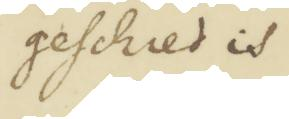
geschied is
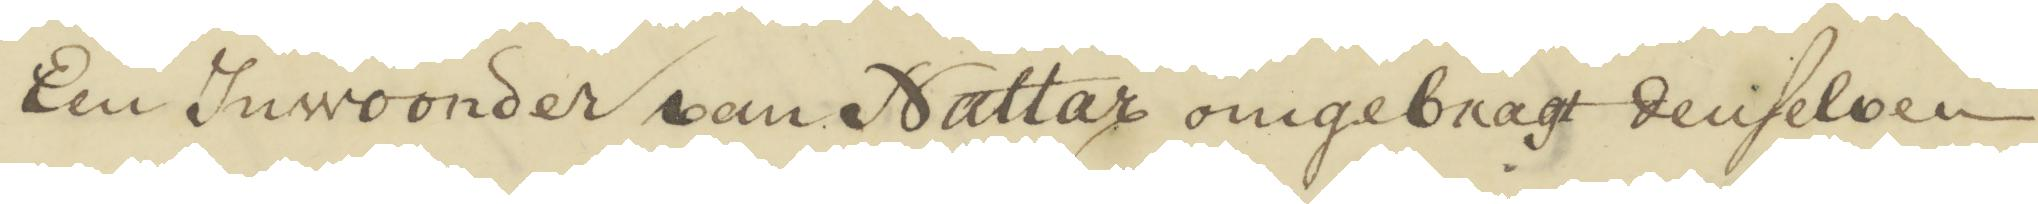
Een Inwoonder van Nattar omgebragt denselven
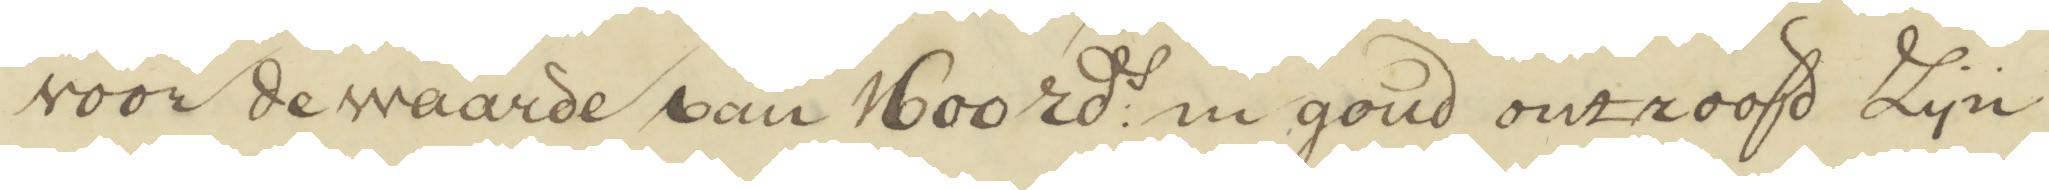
voor de waarde van 1600 rd:s in goud ontroofd zijn
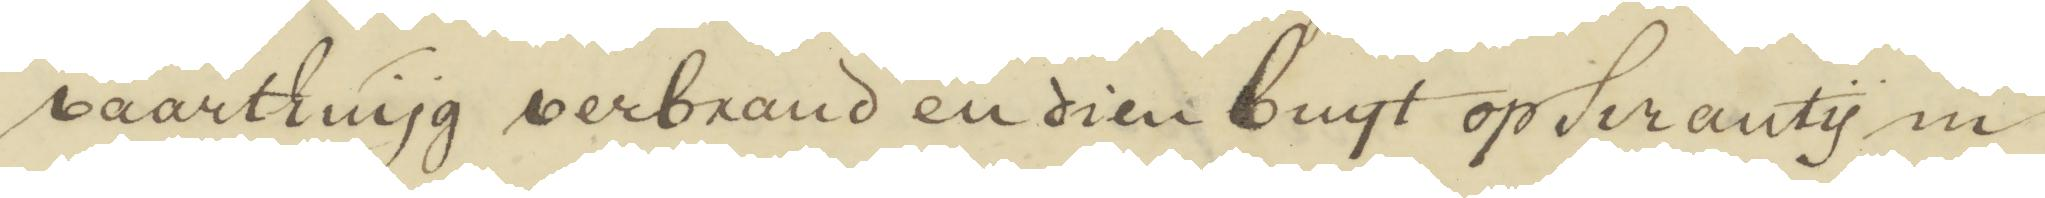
vaarthuijg verbrand en dien buijt op sirantij in
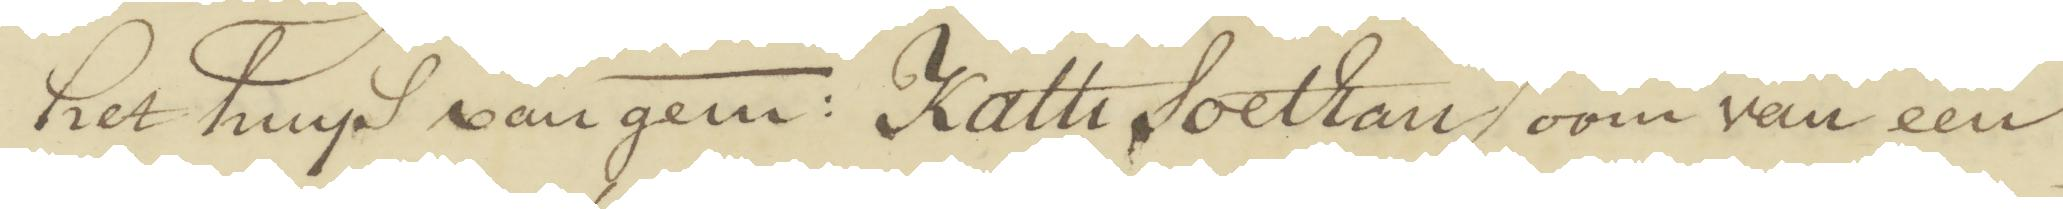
het huys van gem: Katti soethan / oom van een
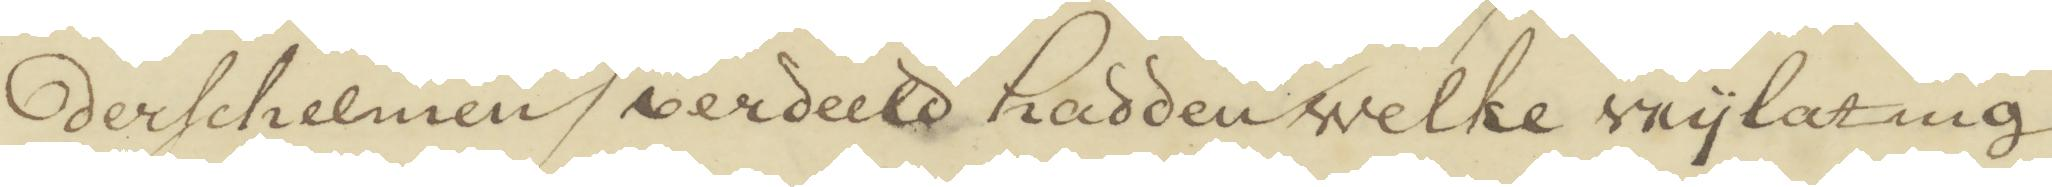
der schelmen/ verdeeld hadden welke vrijlating
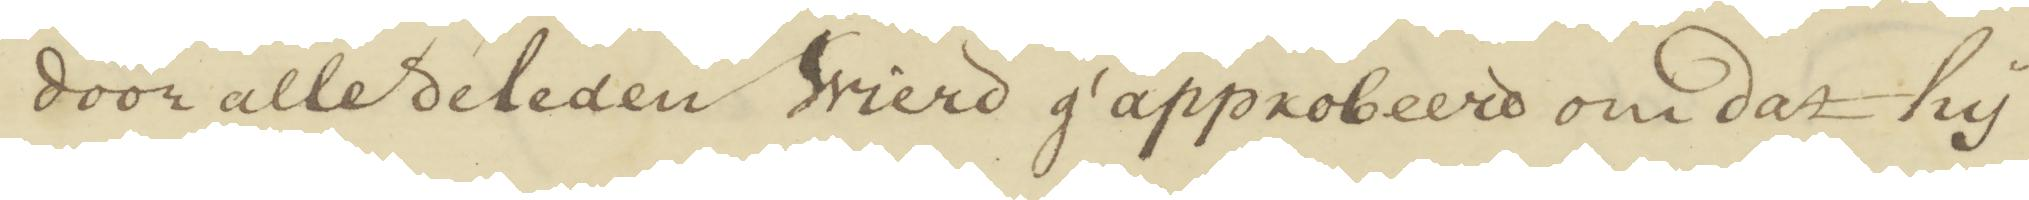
door alle de leden wierd g’approbeerd om dat hij
